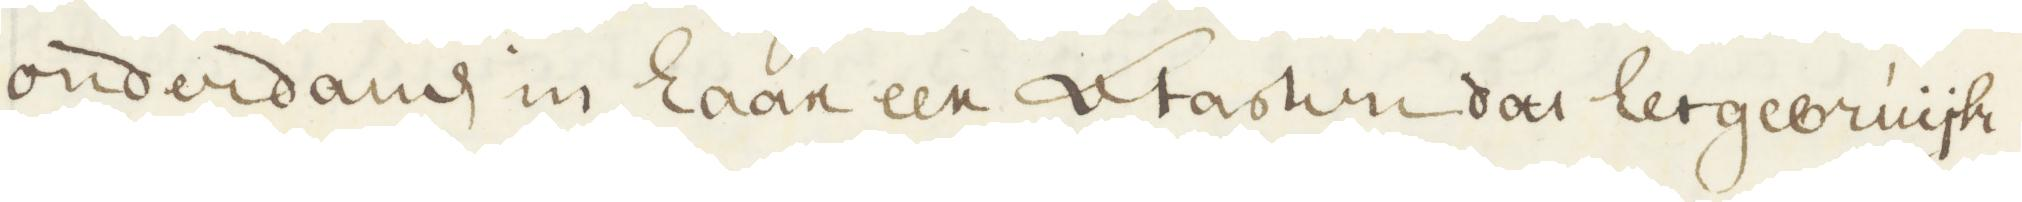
onderdanen in haar eer te tasten dat het gebruijk
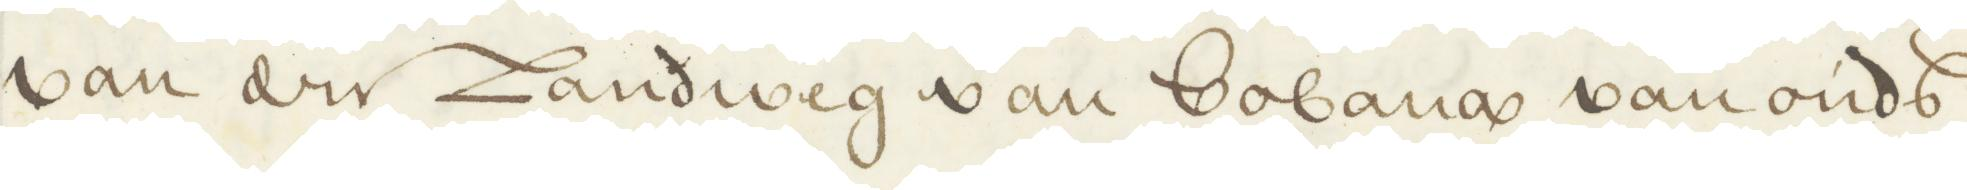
van den landweg van bobana van ouds
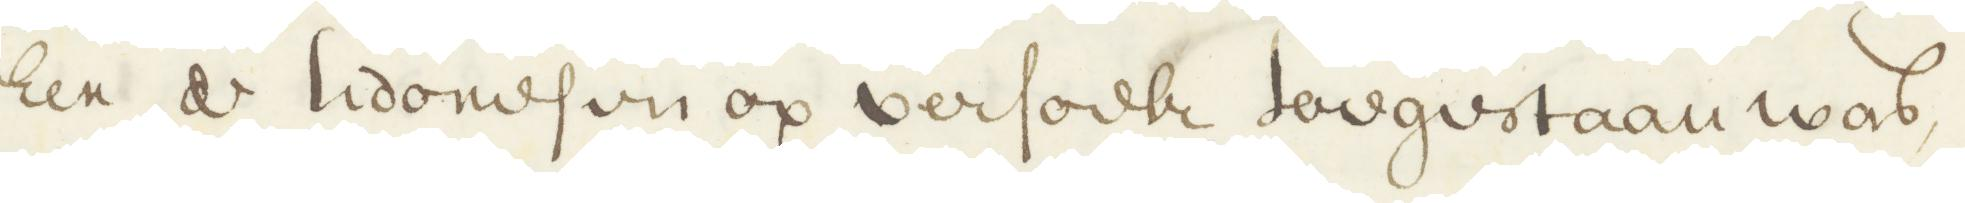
her de tidoresen op versoek toegestaan was,
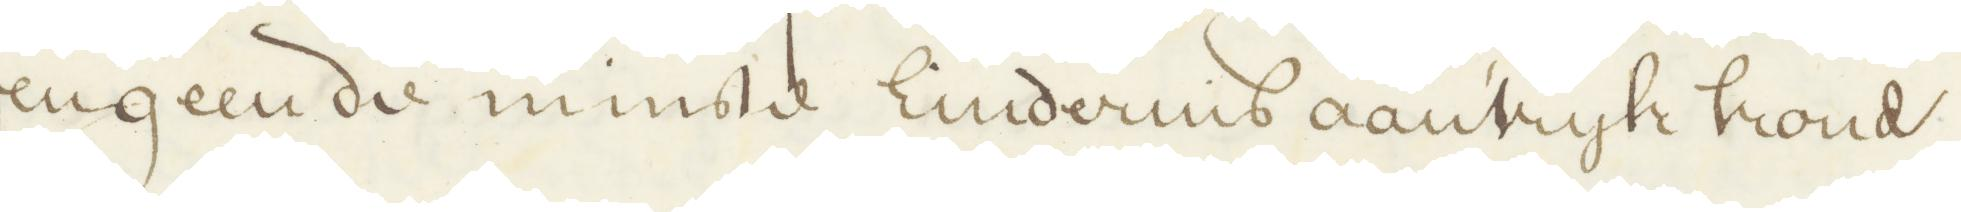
en geen de minste hindernis aan't ryk kond
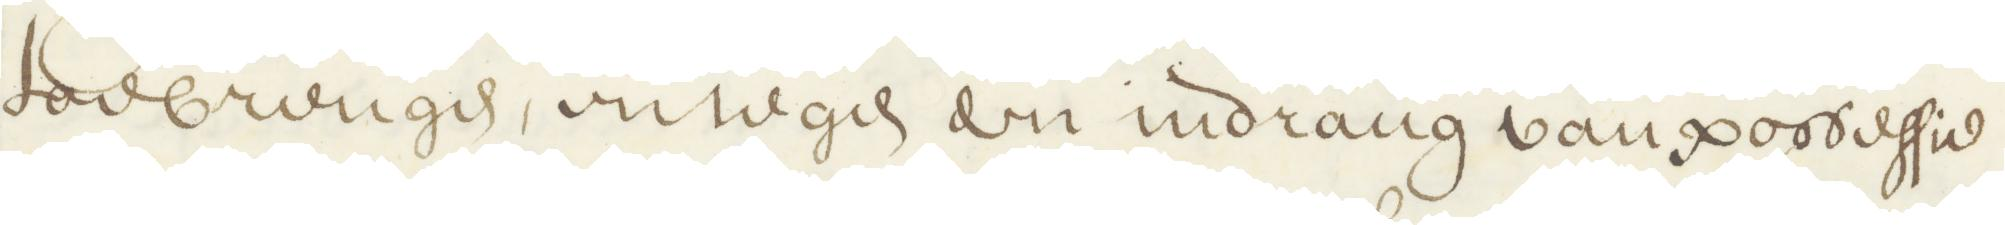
toebrengen, en tegen den indrang van possessie
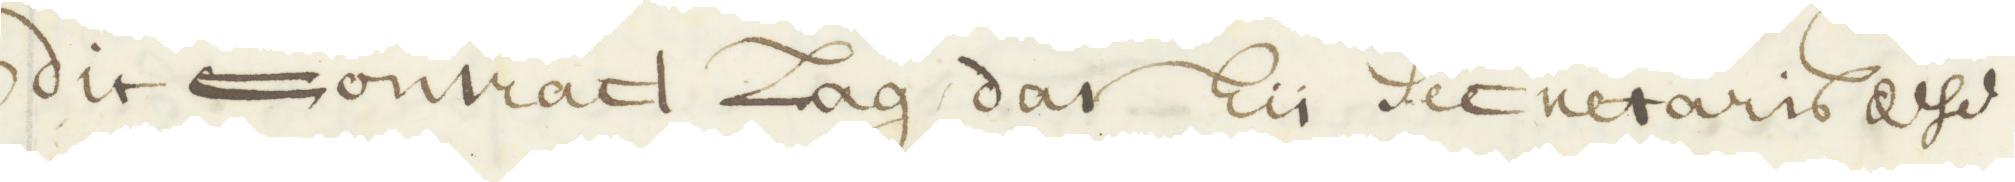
dit contract zag, dat hij secretaris dese
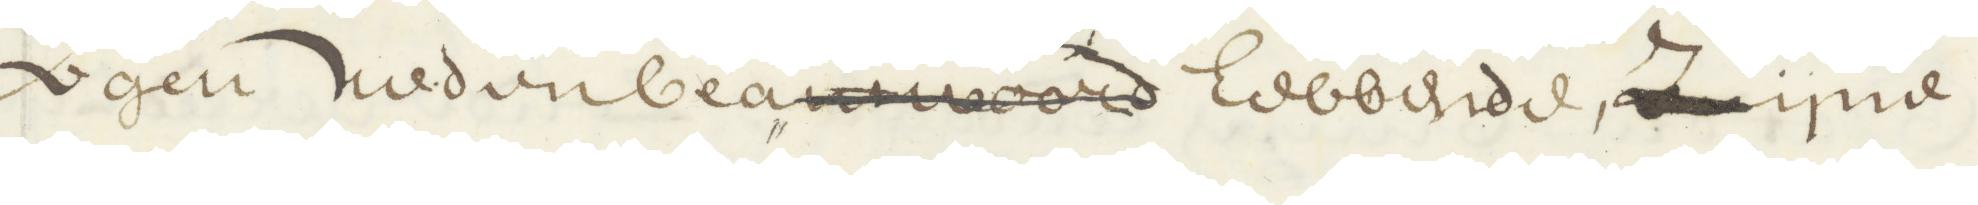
tegen reden bea„ntwoord hebbende, zijne
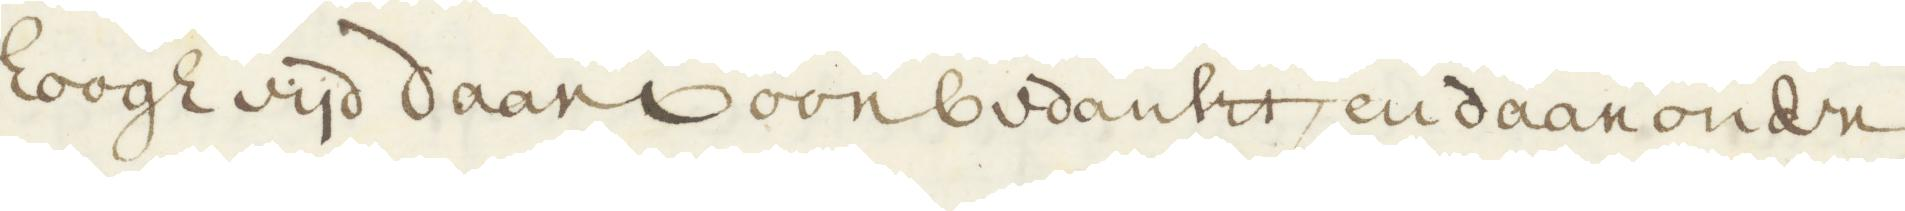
hoogheijd daarvoor bedankt, en daar onder
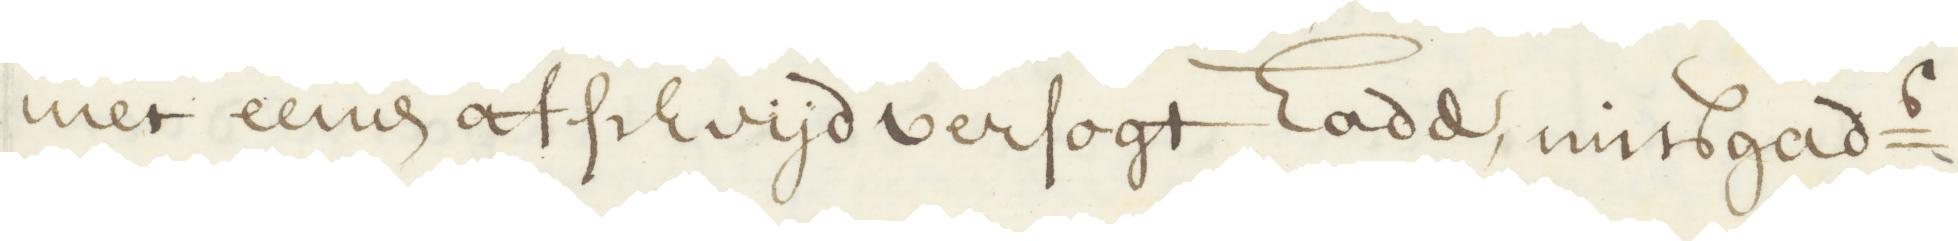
met eenen afscheijd versogt hadd, mitsgad=s
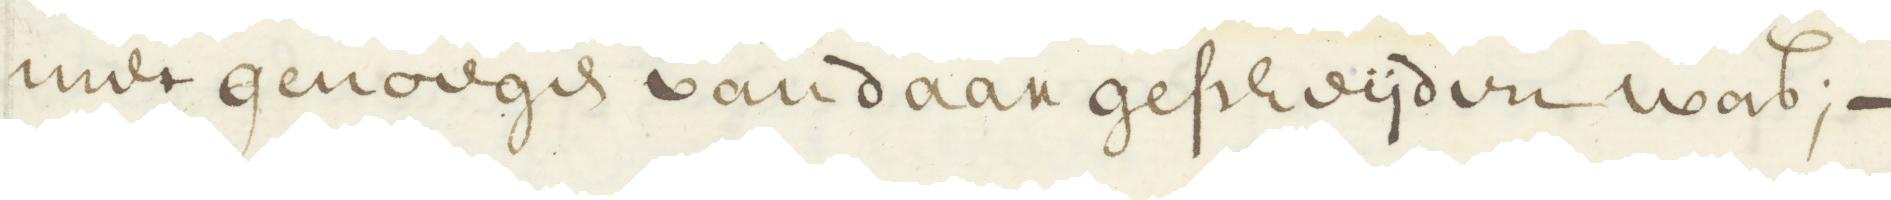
met genoegen van daar gescheijden was; —
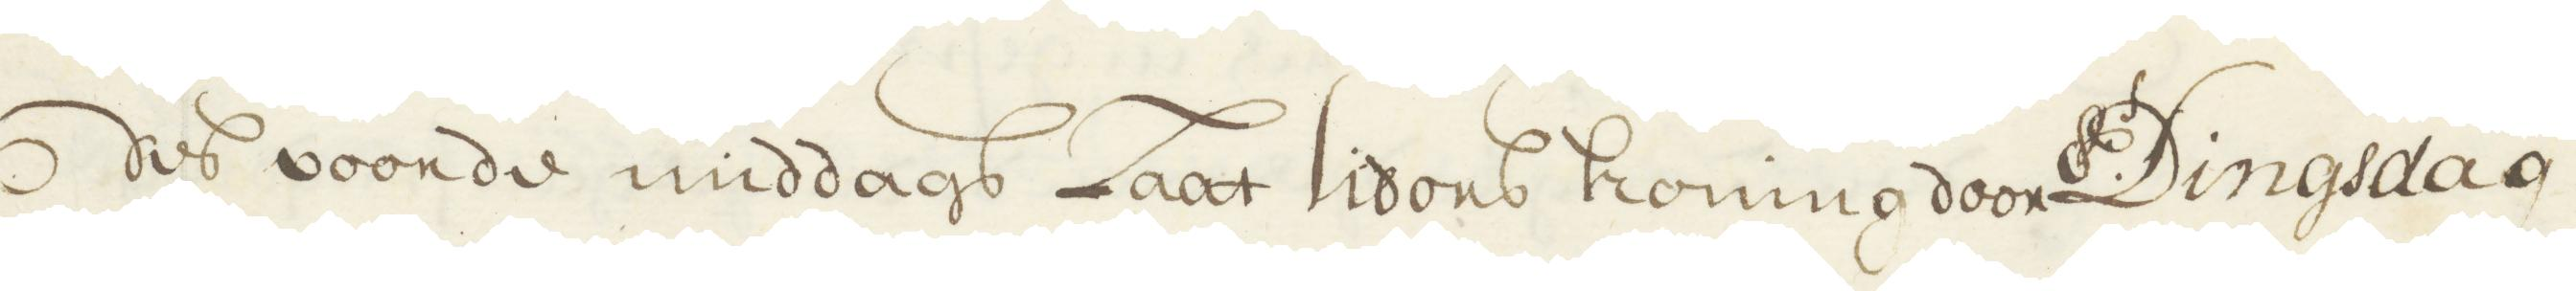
des voor de middags laat tidors koning door Dingsdag
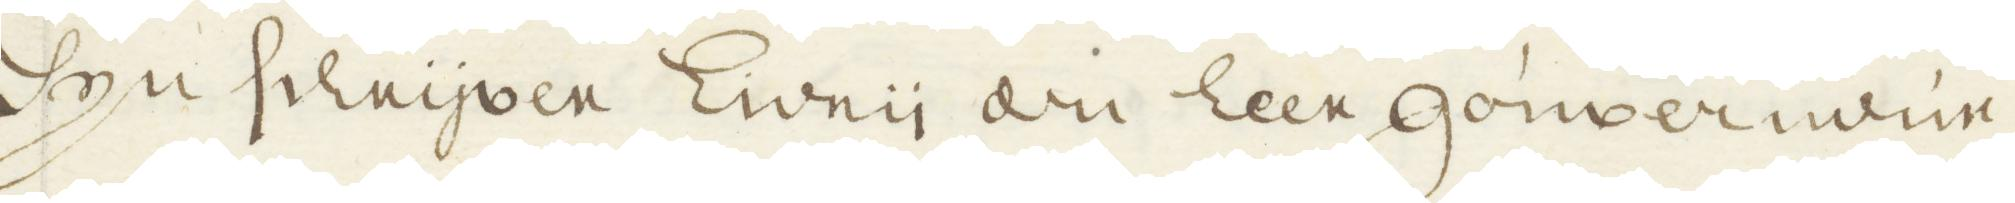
syn schrijver hierij den heer gouverneur
